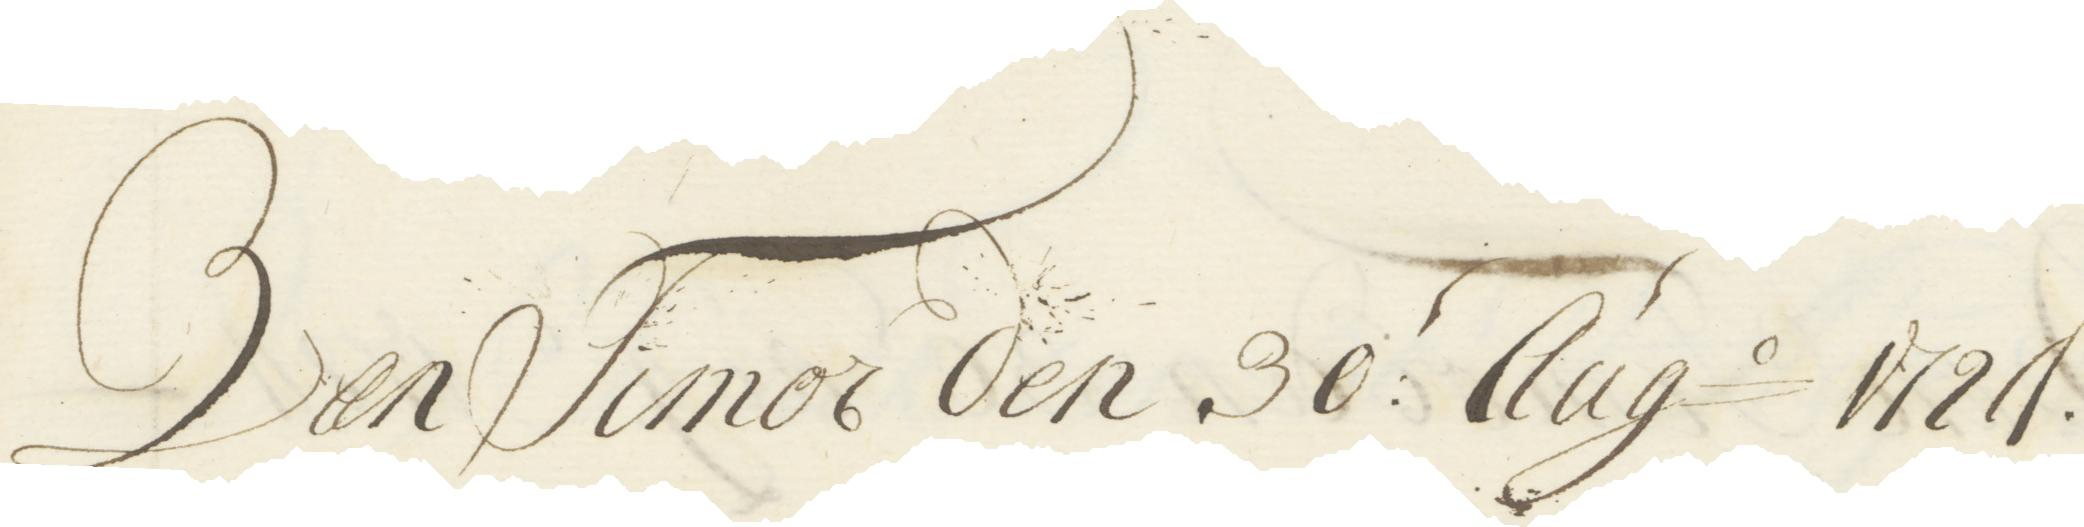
Van Timor den 30:' Aug=o 1724.
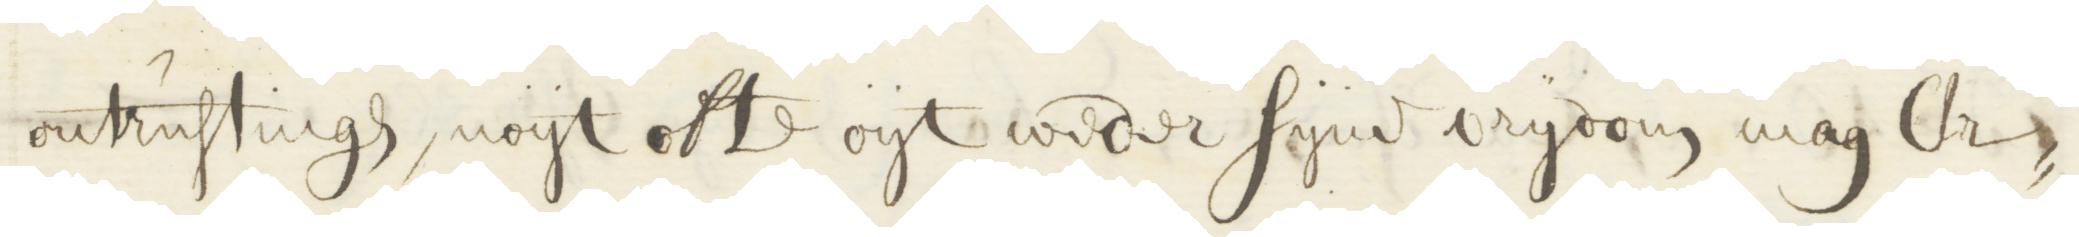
ontrustingen, noijt ofte oijt weder sijne vrijdom mag Er„
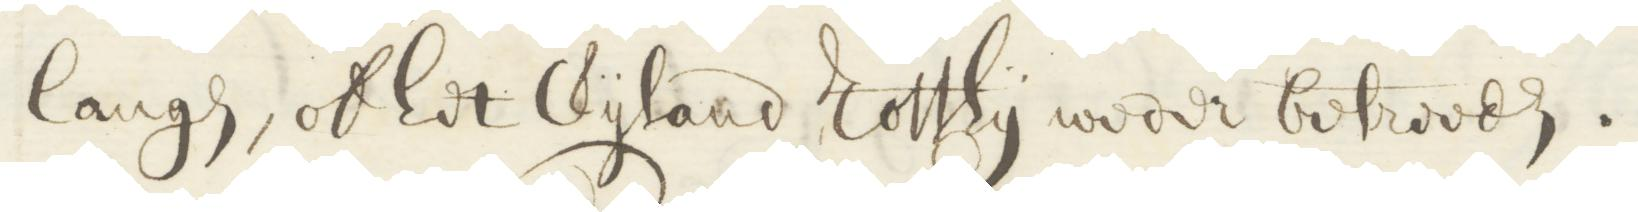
langen, of het Eijland rotthij weder betreeden.
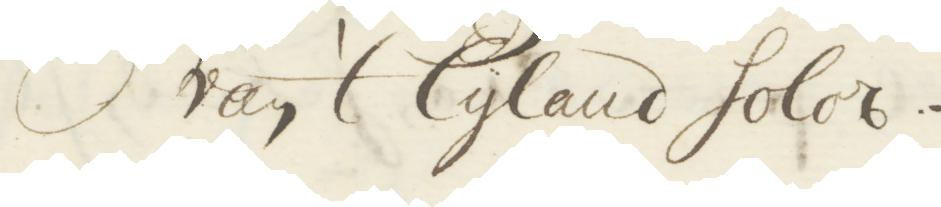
van 't Eijland solor
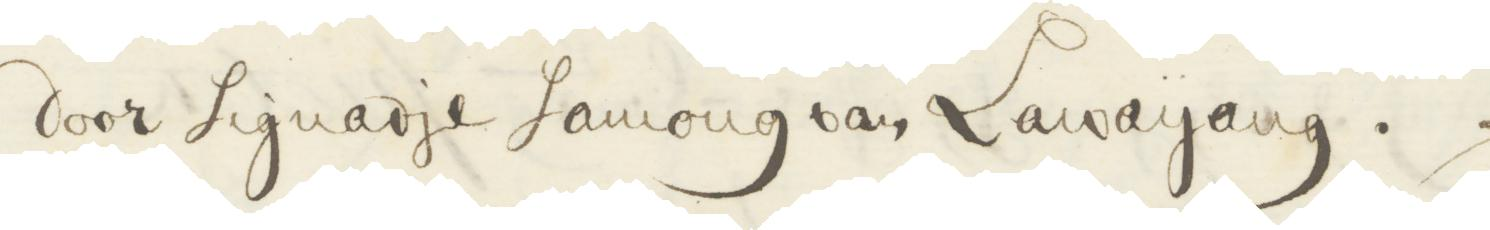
door signadje samong van Lawaijang.
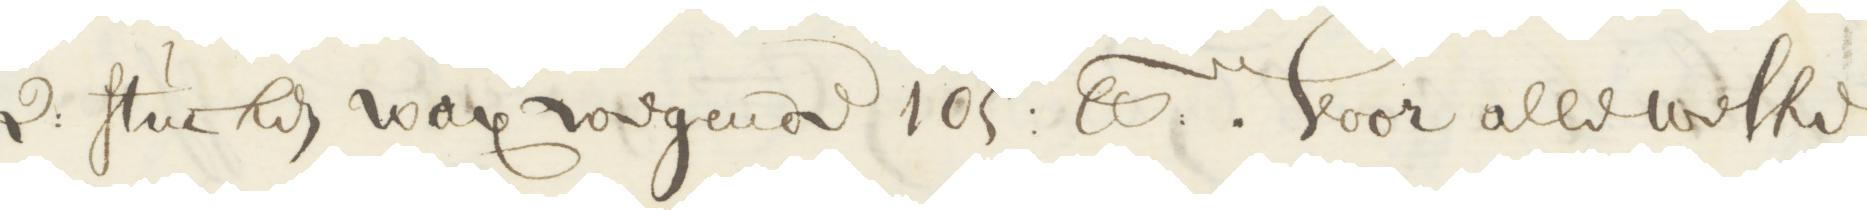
2: stucken wax wegende 105: lb:. voor alle welke
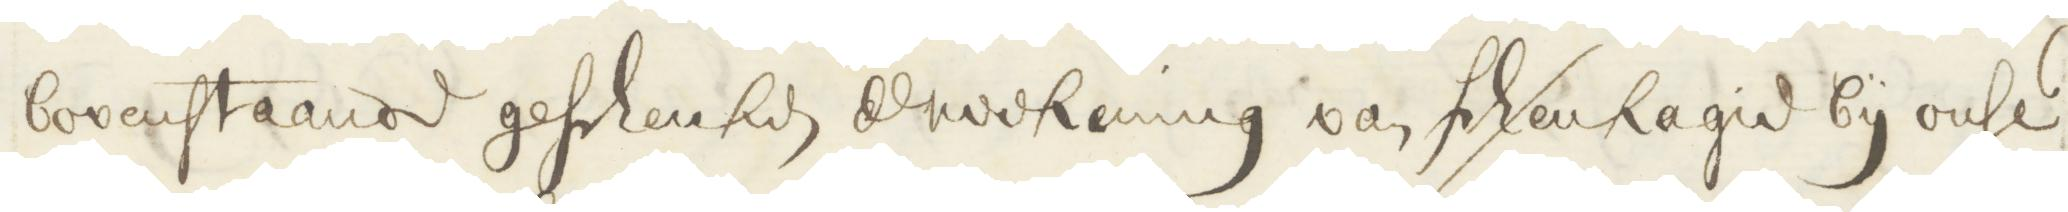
bovenstaande geschenken de reekening van schenkagie bij onse
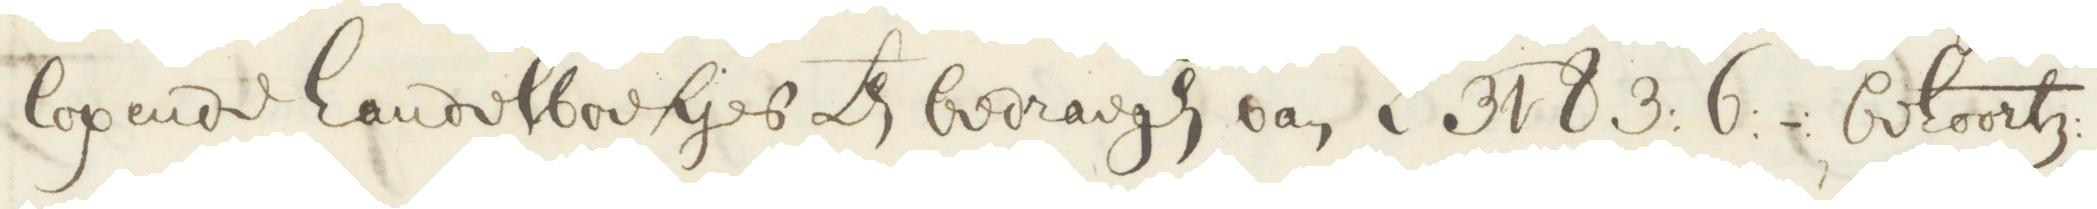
lopende handelboekjes ten bedraegen van ƒ 3183: 6: -: behoorlijk
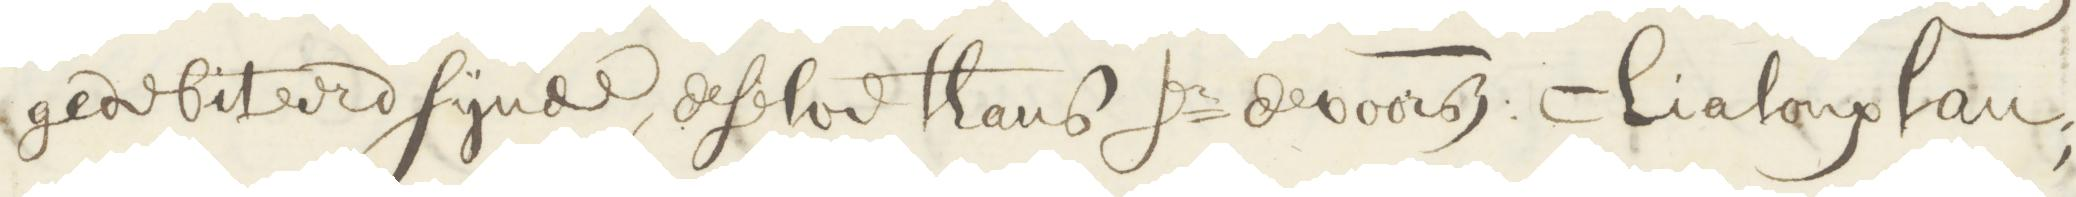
gedebiteerd sijnde, deselve thans p=r devoorsz: chialoup lan„
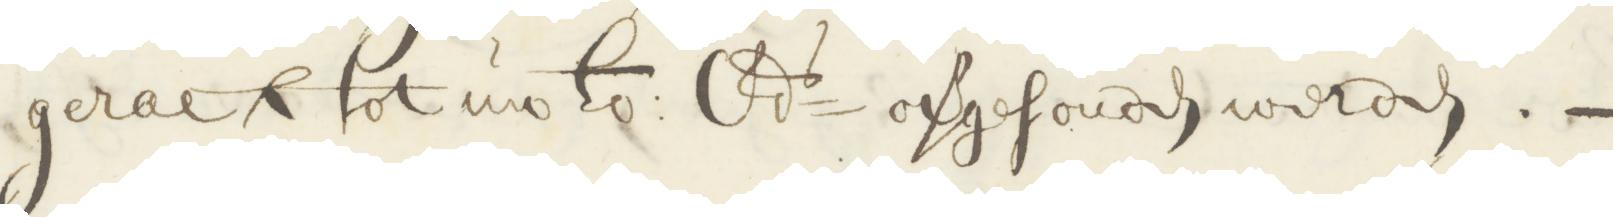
gerack tot uw ho: Ed=s overgesonden werden.-
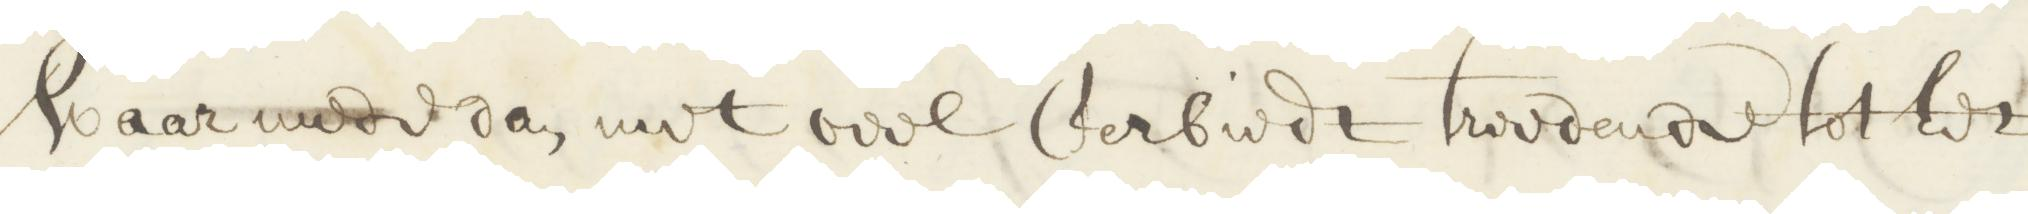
waar mede dan met veel Eerbiedt treedende tot het
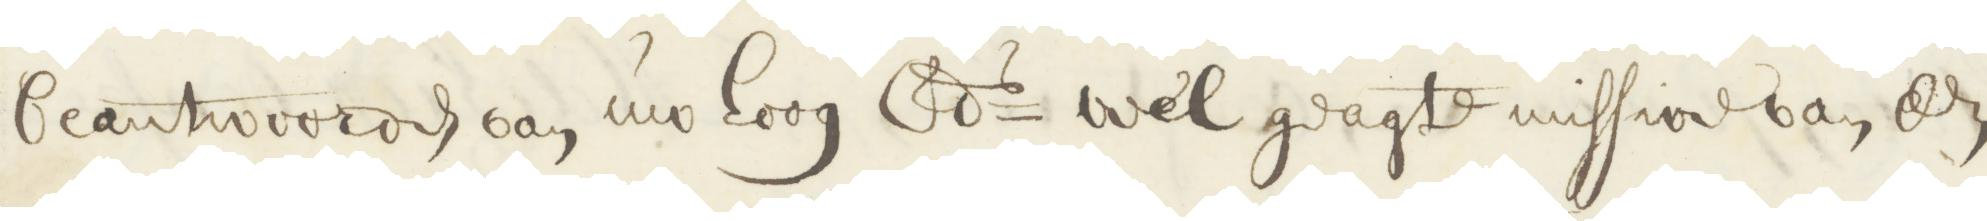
beantwoorden van uw hoog Ed=s wel geagte missive van den
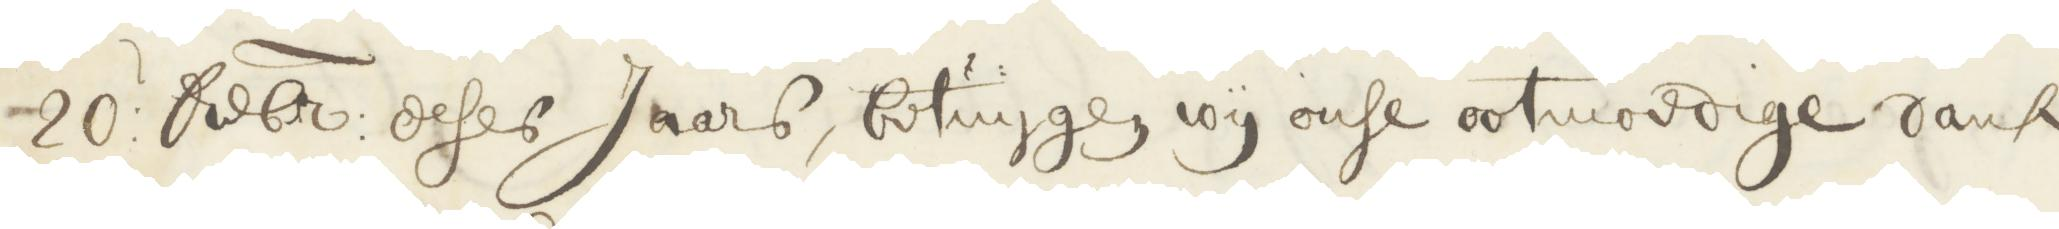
20:' febr: deses Jaars, betuijgen wij onse ootmoedige dank
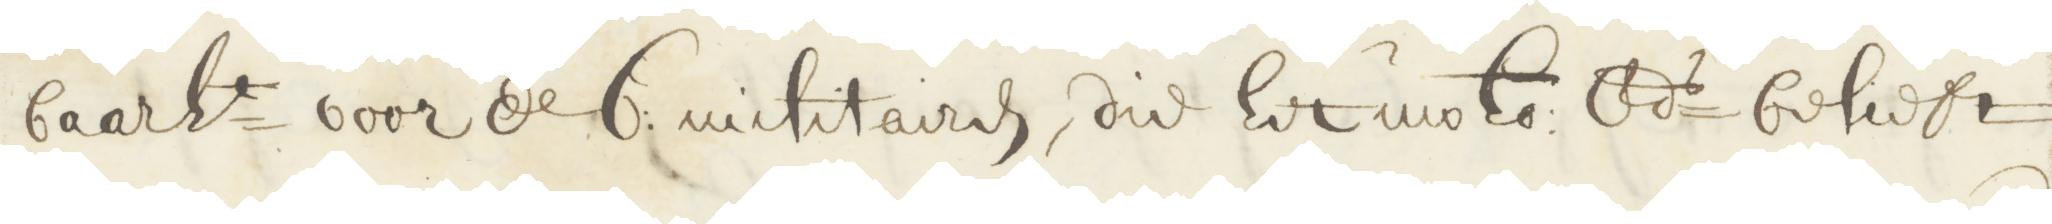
baarh=t voor de 6: militairen, die het uw ho: Ed=s belieft
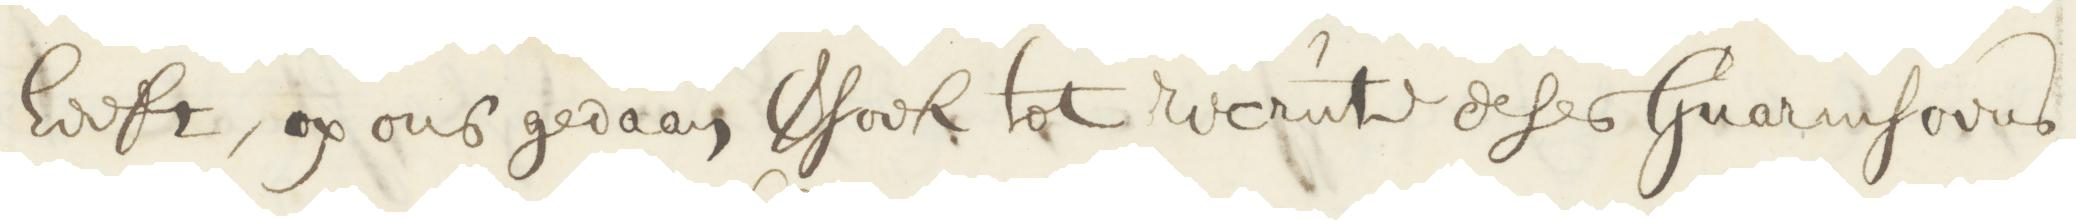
heeft, op ons gedaan versoek tot recrute desesGuarnisoens
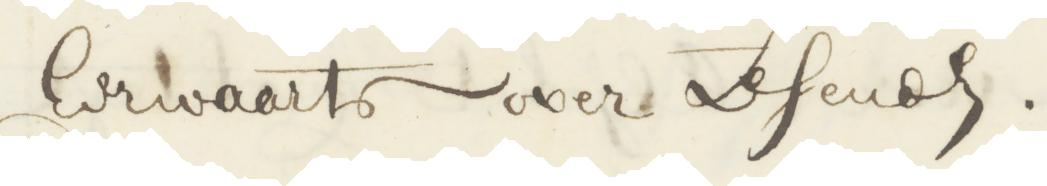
herwaarts over tesenden.
